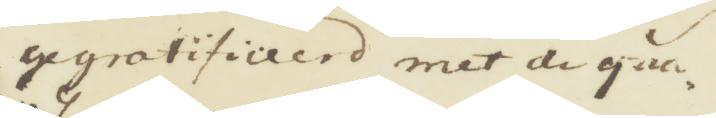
gegratifieerd met de qua„
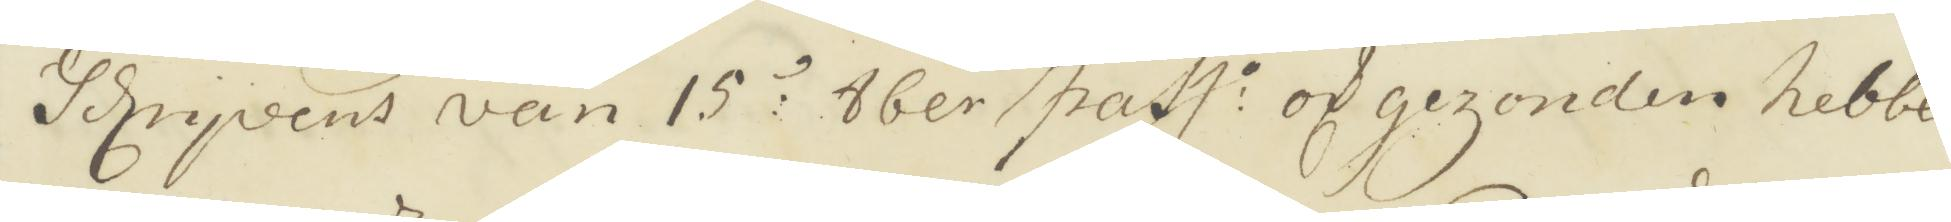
scrijvens van 15:' 8ber pass:o overgezonden hebben
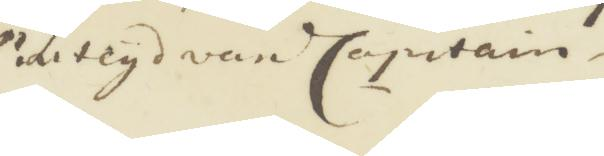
liteijd van Capitain
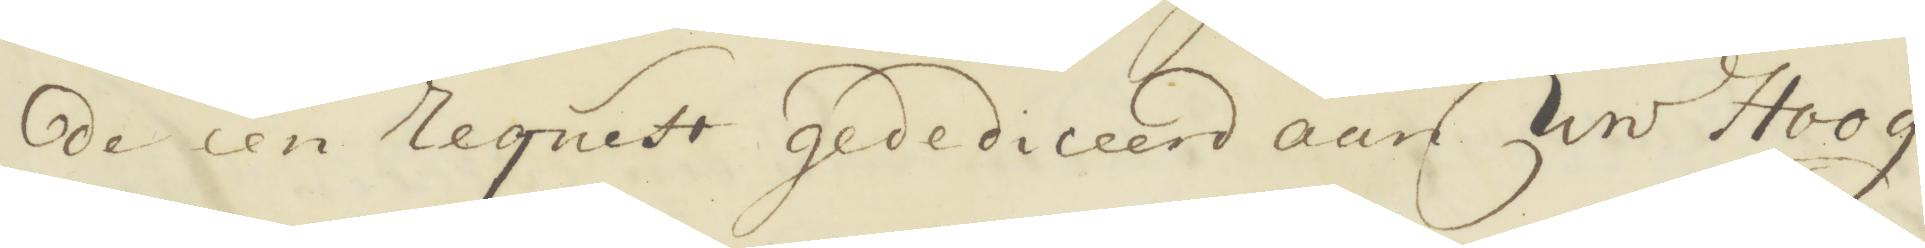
de een request gedediceerd aan uw Hoog
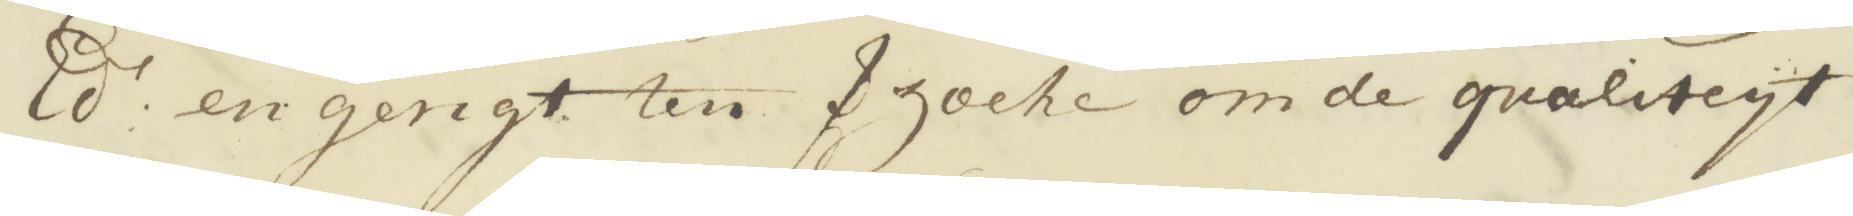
Ed:s en gerigt ten verzoeke om de qualiteijt
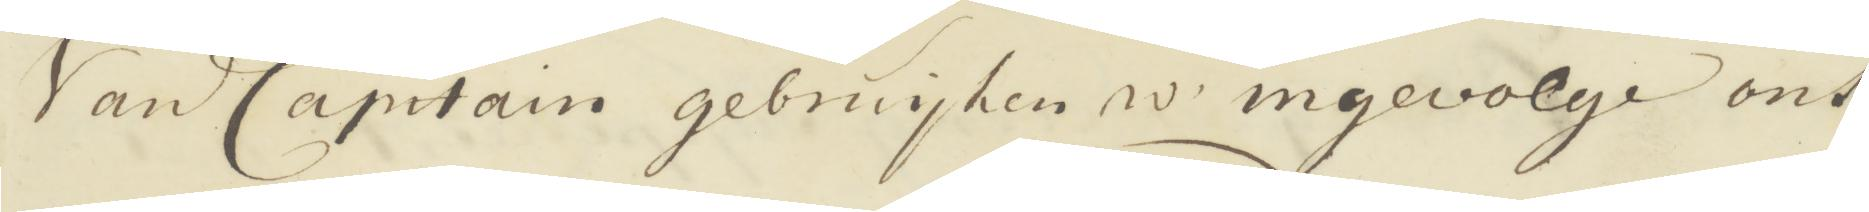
Van Capitain gebruijken w' ingevolge ons
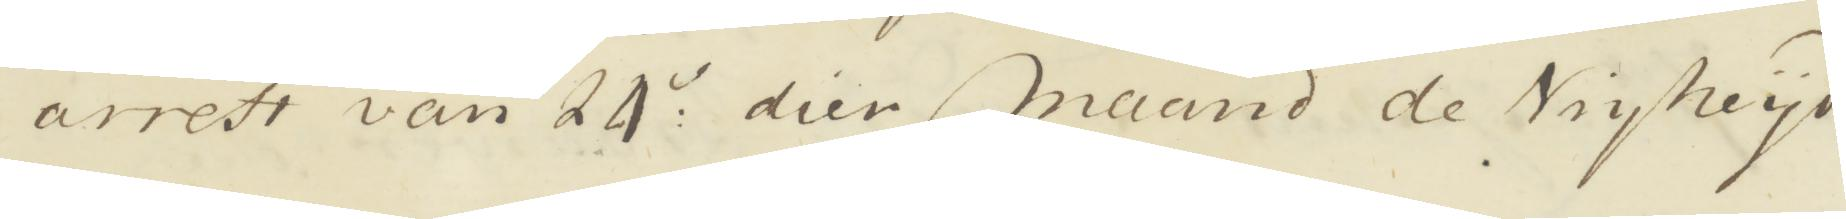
arrest van 24:' dier maand de Vrijheijd
